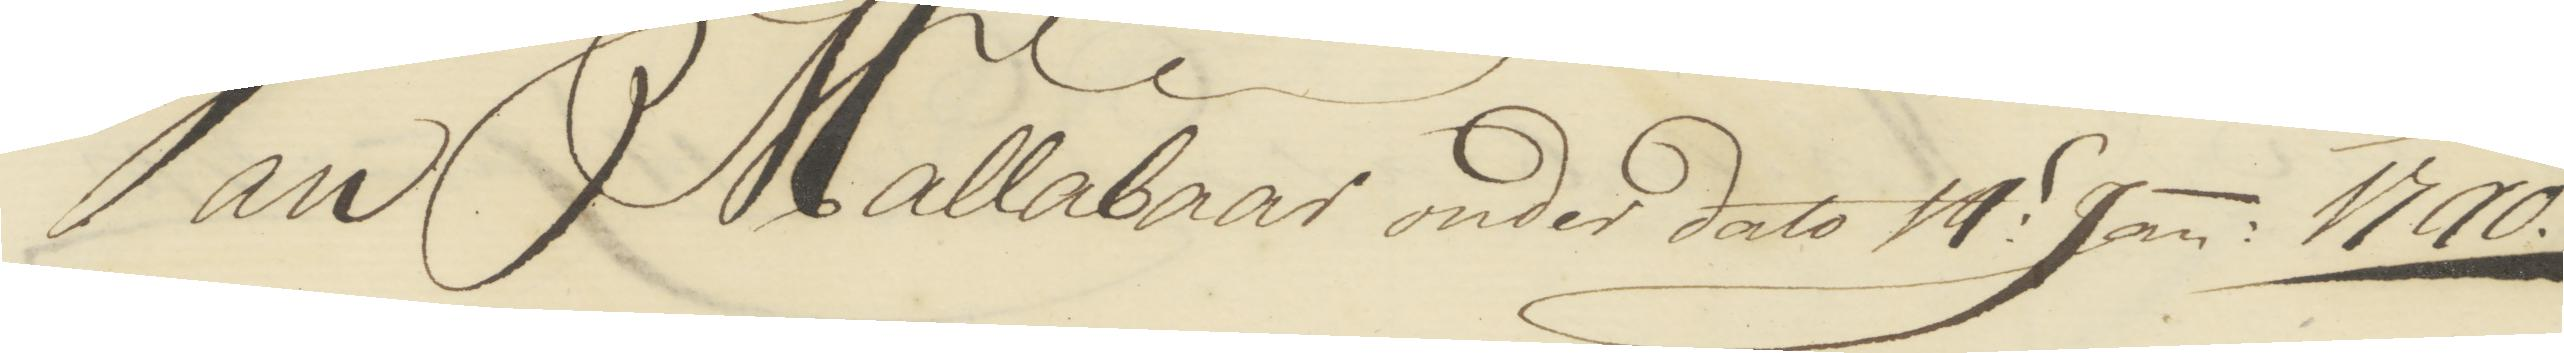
Van Mallabaar onder dato 14:' Jan: 1740:
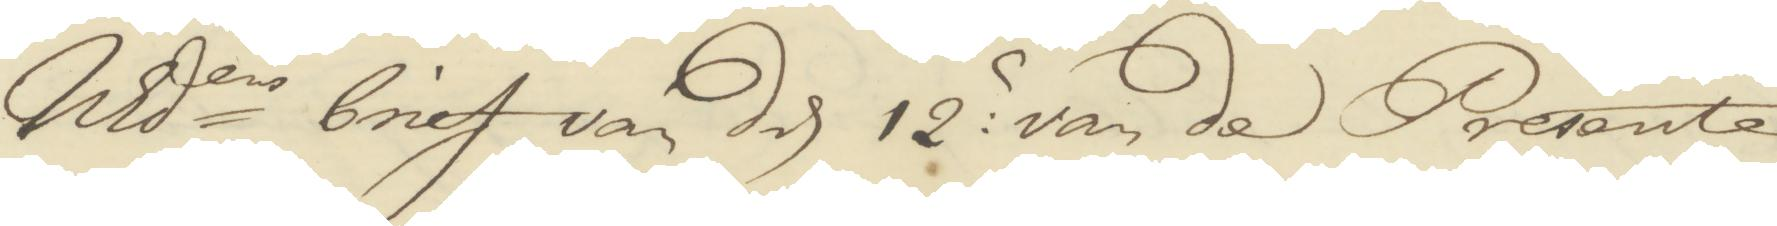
UEd=len brief van den 12:' van de Presente
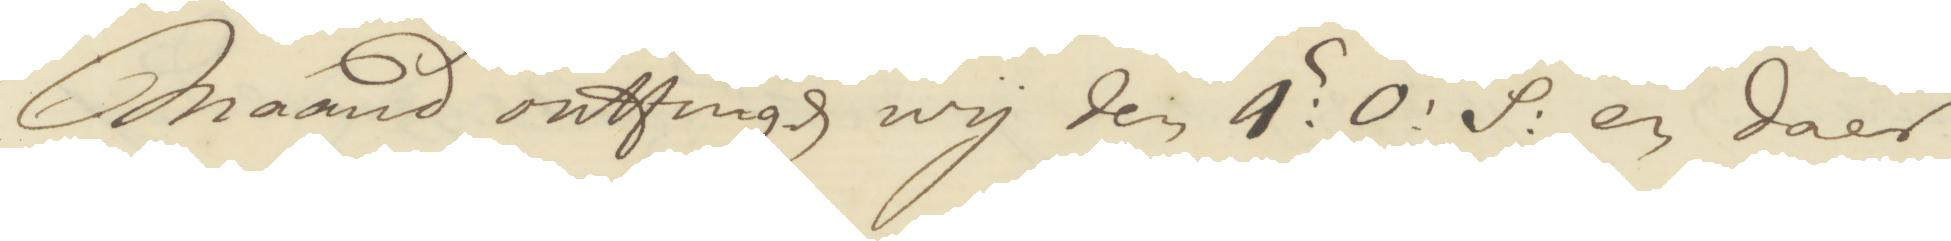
maand ontfingen wij den 4:' O: S: en daer
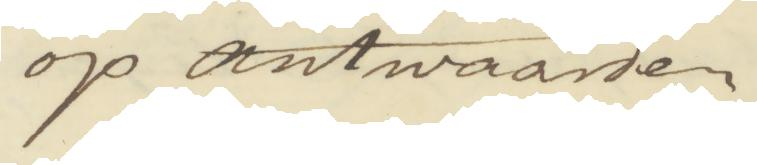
op Antwoorden
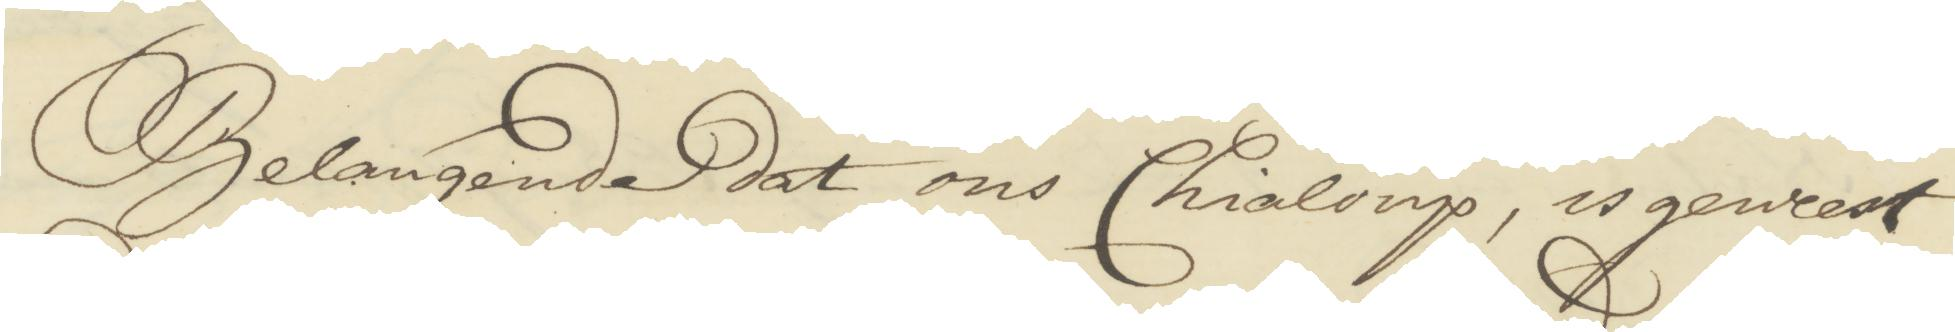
Belangende dat ons Chialoup, is geweest
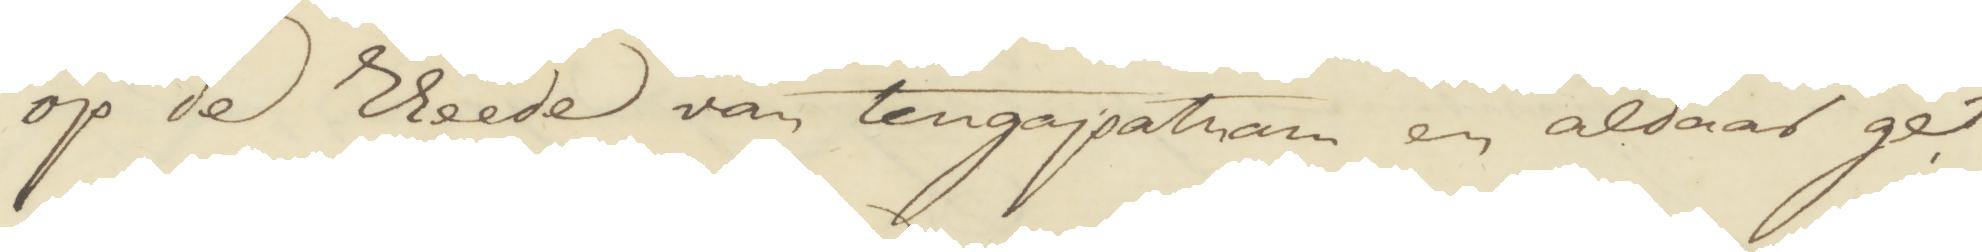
op de rheede van tengapatnam en aldaar ge„
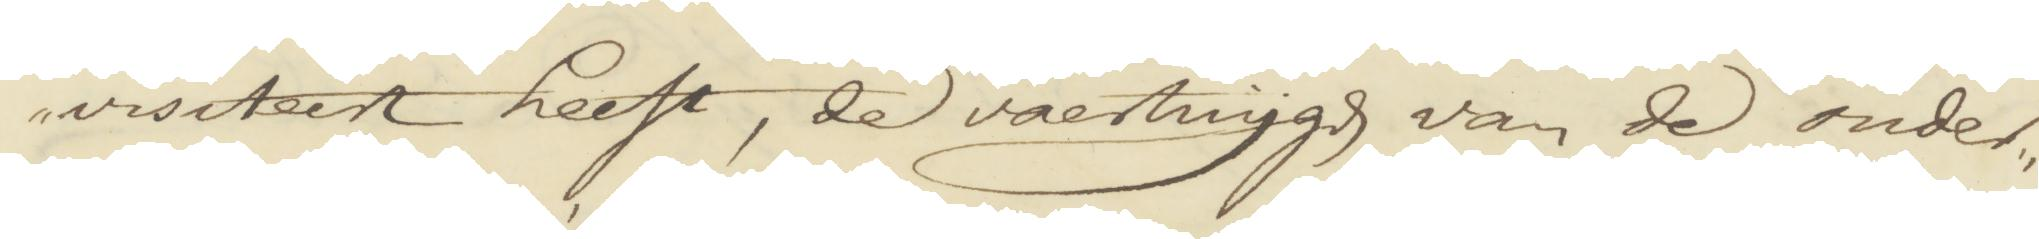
„visiteert heeft, de vaertuijgen van de onder„
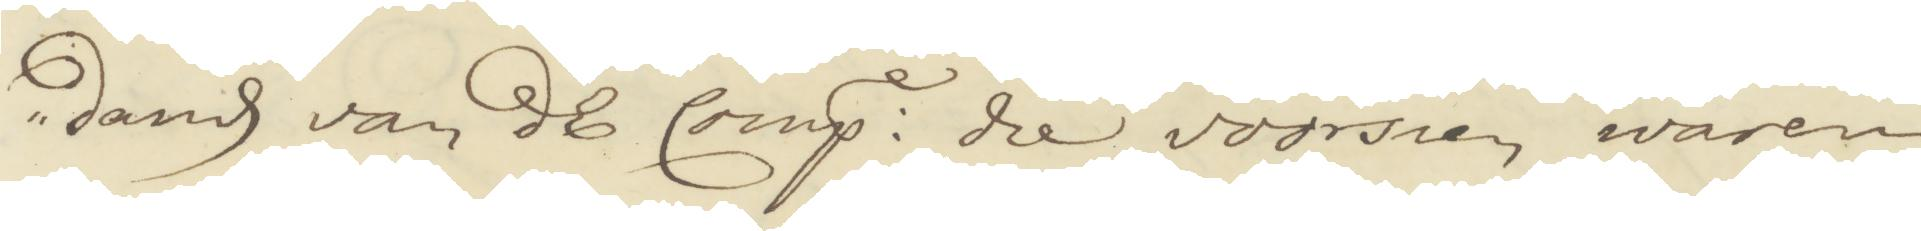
„danen van d'E Comp:e die voorsien waren
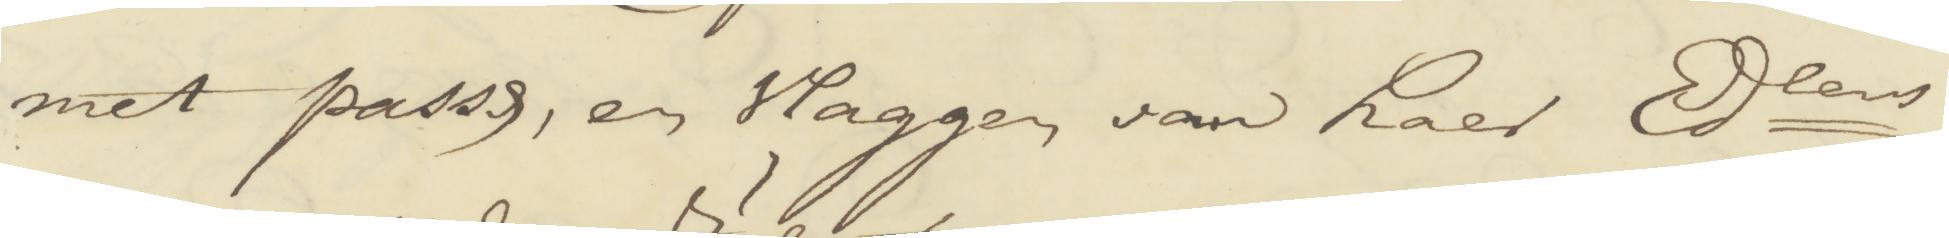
met passen, en vlaggen van haer ED=lens
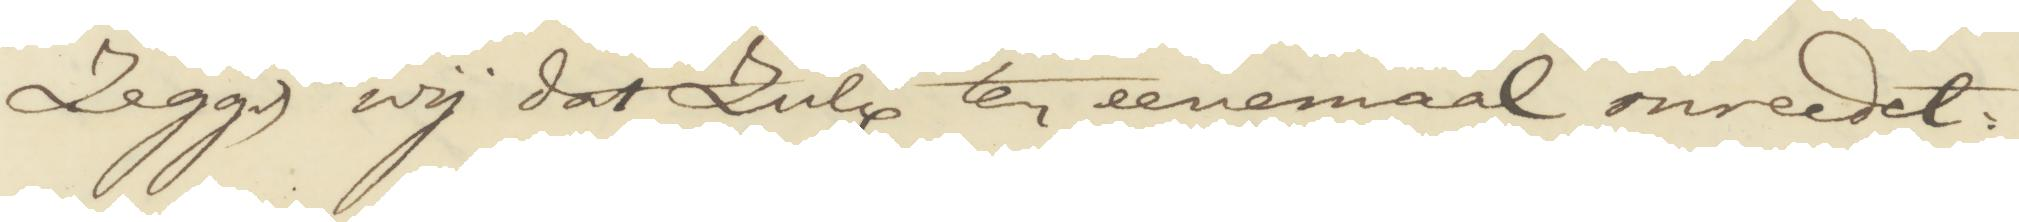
zeggen wij dat zulx ten eenemaal onreedel:
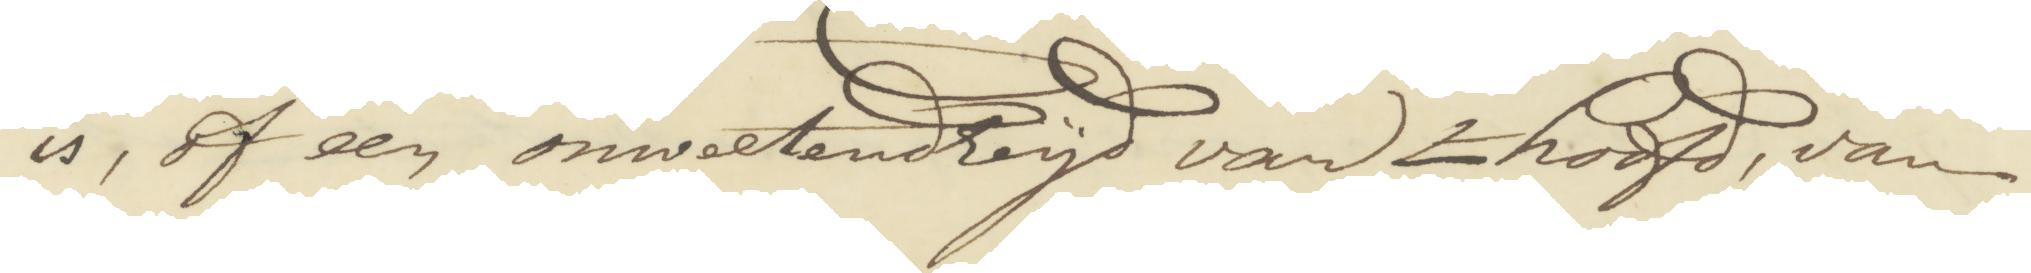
is, off een onweetendheijd van 't hoofd, van
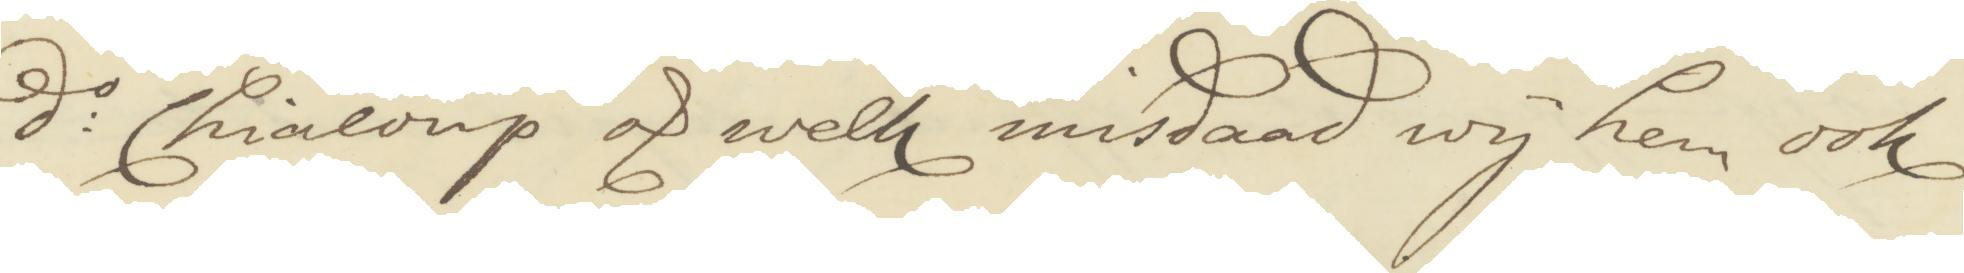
d:o Chialoup over welk missaad wij hem ook
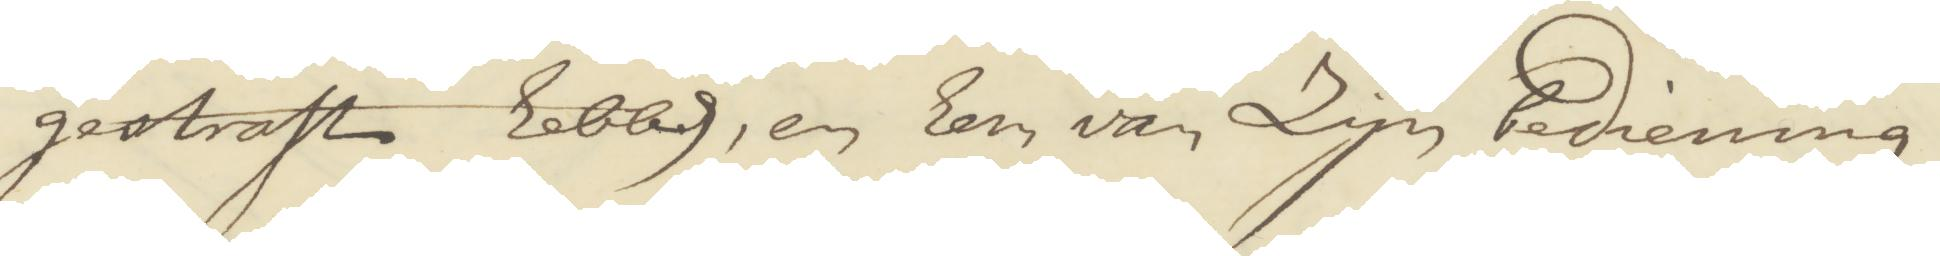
gestraft hebben, en hem van zijn bediening
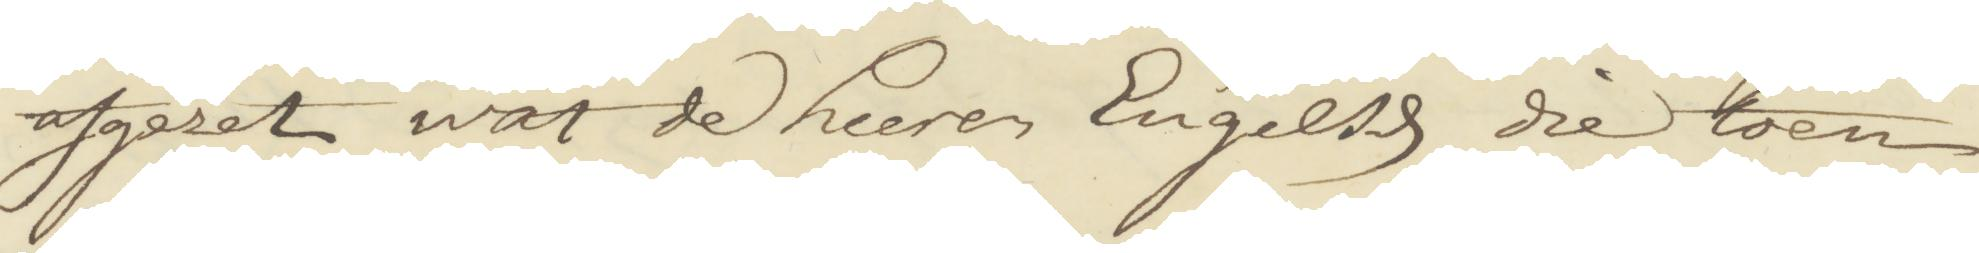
afgezet wat de heeren Engelsen die toen
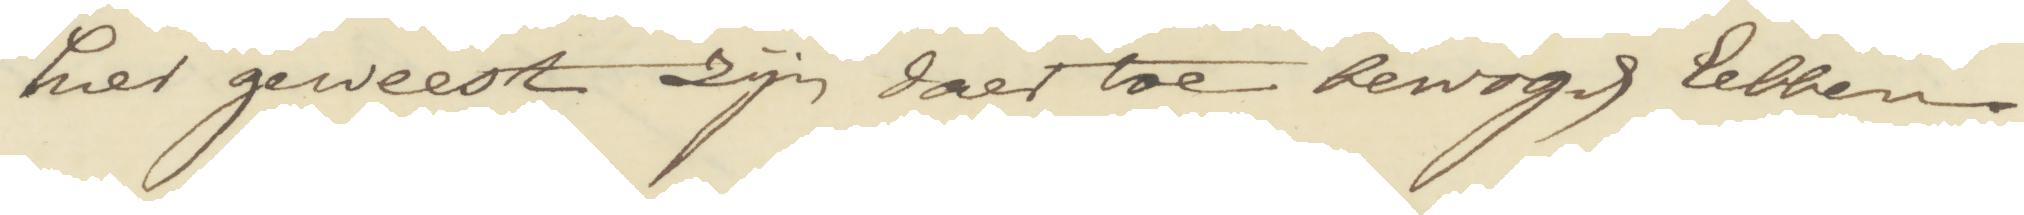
hier geweest zijn daer toe bewogen hebben,
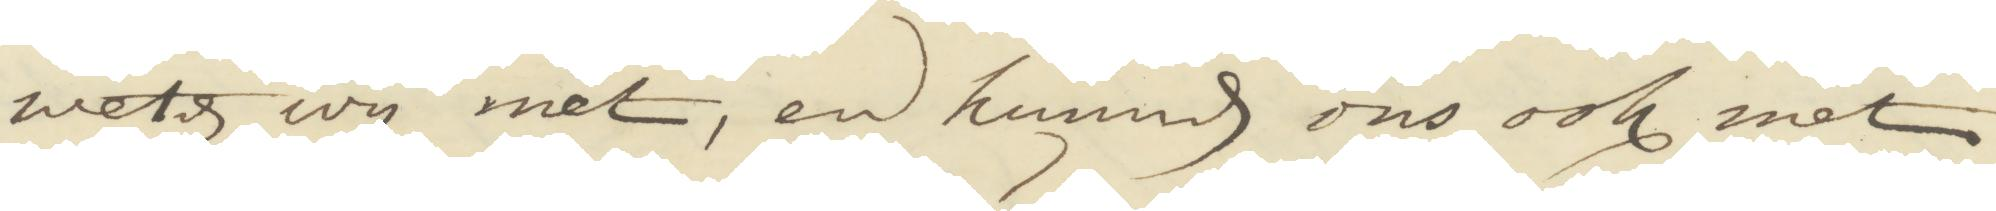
weten wij niet, en kunnen ons ook niet
